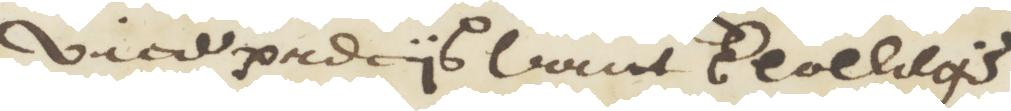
vice precijs vant E college
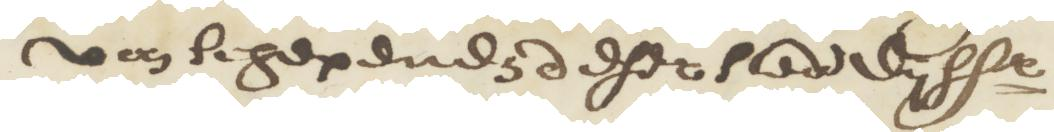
van schepenen deser stede Eijss=r
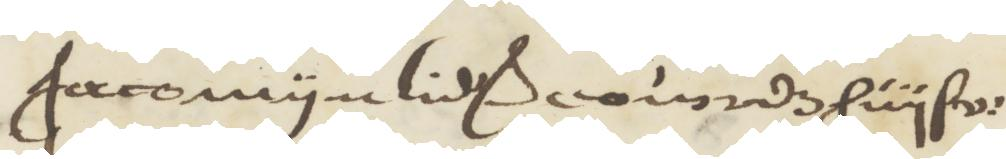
jacomijntie vercounden huijsv:
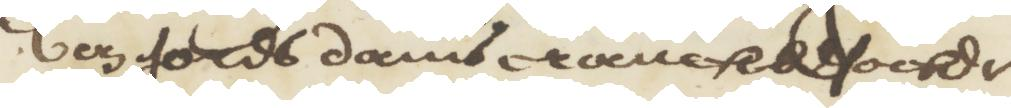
van jores dams cranckbesoecker
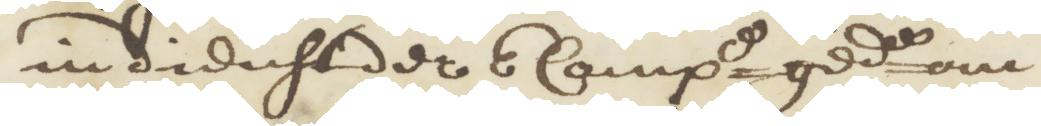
in dienst der E Comp=e ged=e om
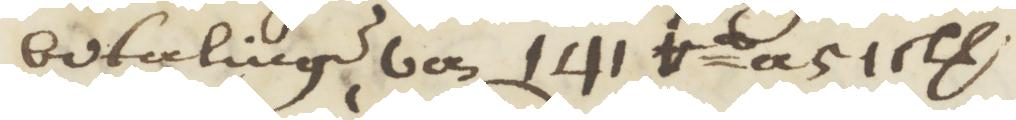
betalinge van 141 R=a a 51 stver
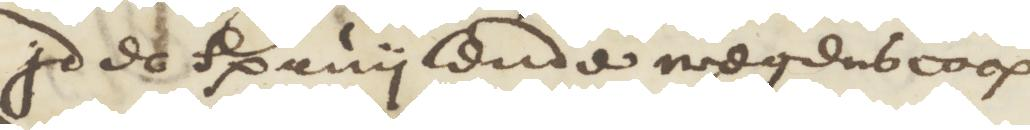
jder spruijtende wegens coop
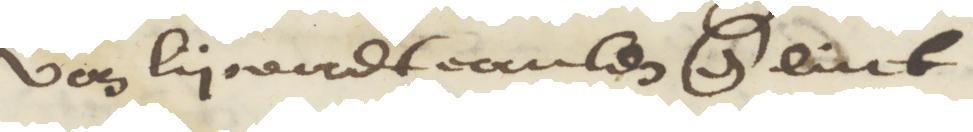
van lijwaet canten ende lint
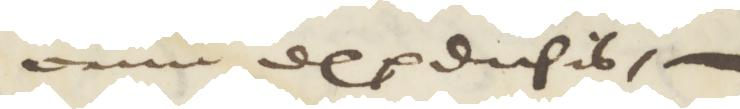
cum expensis, —
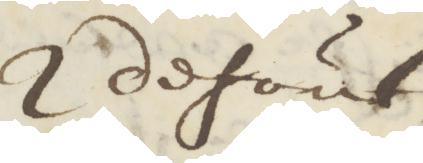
2 defout
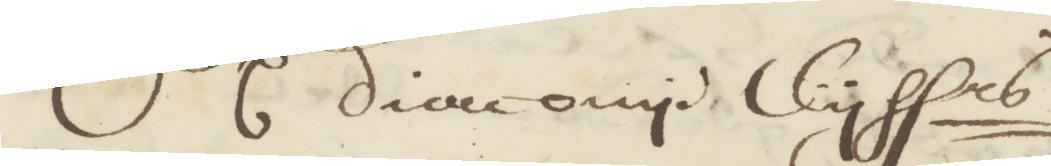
D E diaconije Eijss=rs
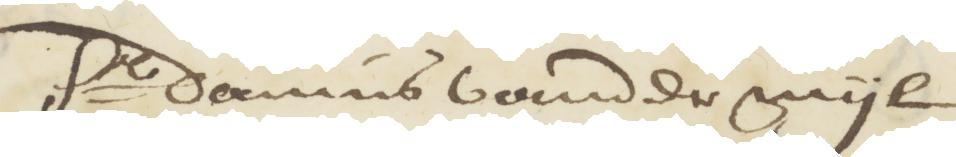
S=r danius van der mijl
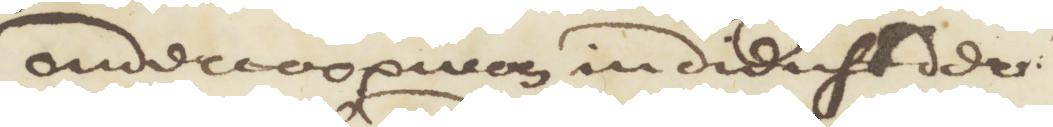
ondercoopman in dienst der
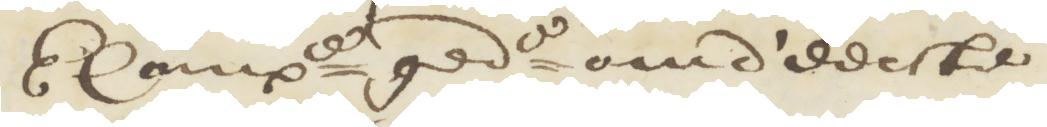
E Comp=e ged=e om d’eerste
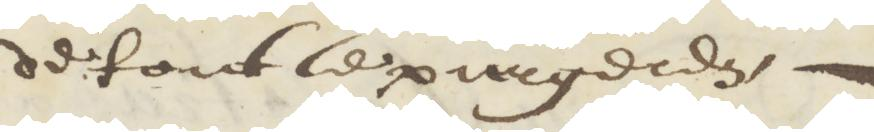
defout te purgeren, —
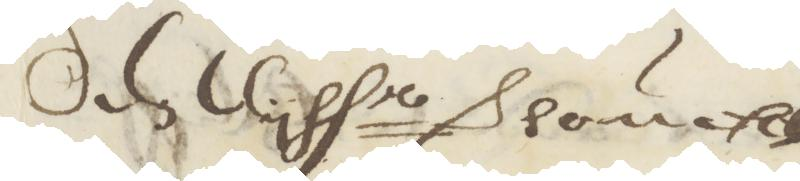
des Eijss=r versouckt
